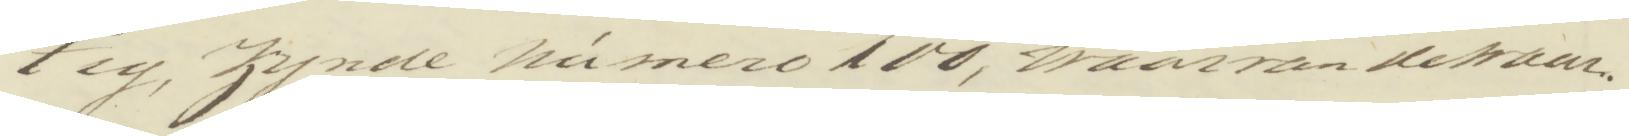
tig, zynde Numero 400, waarvan de waar„
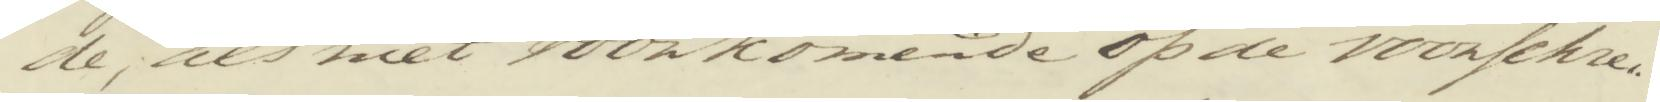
de, als niet voorkomende op de voorschre„
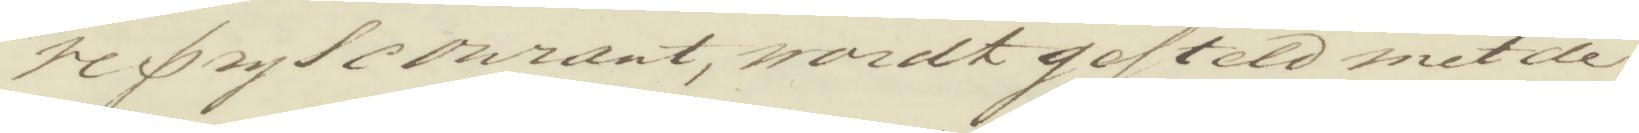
ve pryscourant, wordt gesteld met de
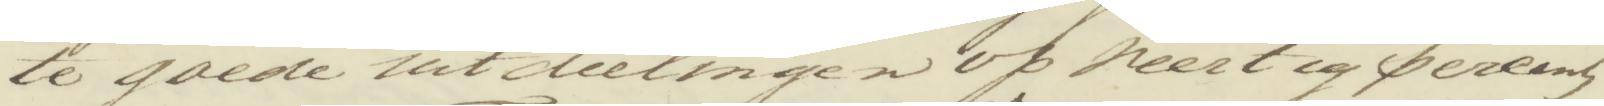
te goede uitdeelingen op Veertig percent
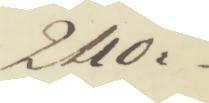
240:
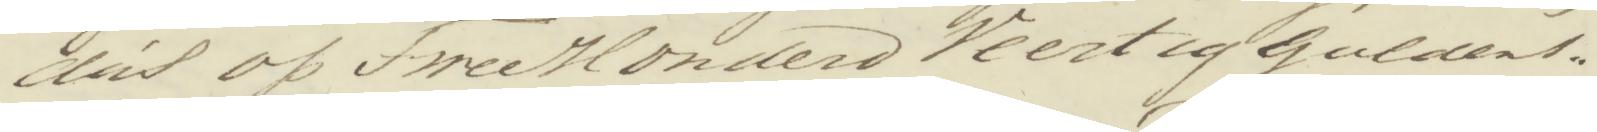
dus op Twee Honderd Veertig Guldens.
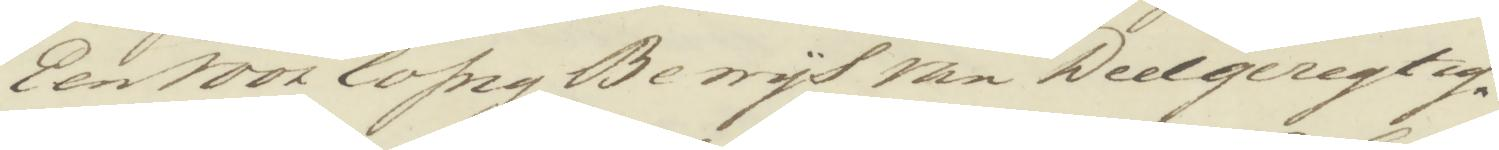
Een voorlopig Bewijs van Deelgeregtig„
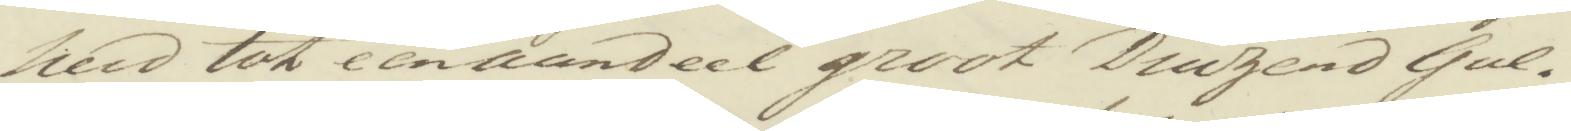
heid tot een aandeel groot Duizend Gul„
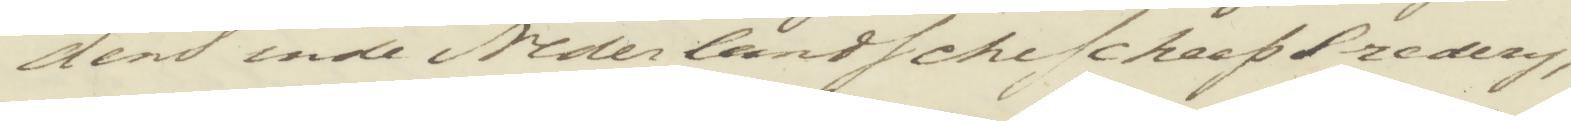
dens in de Nederlandsche scheeptredery,
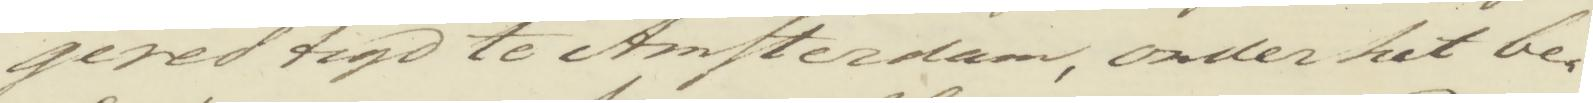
gevestigd te Amsterdam, onder het be
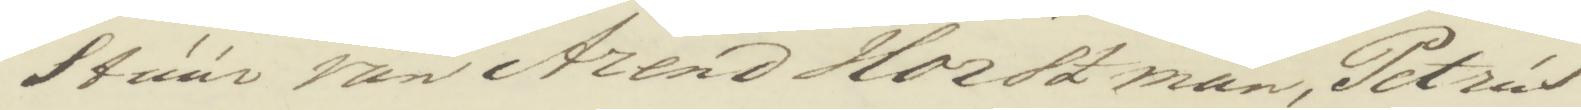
stuur van Arend Horstman, Petrus
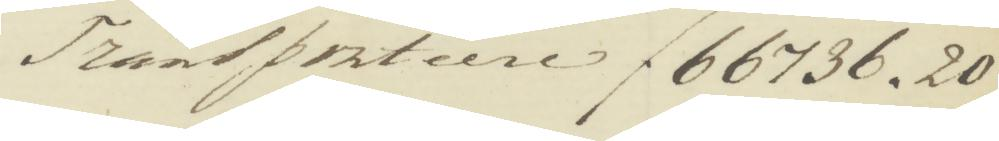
Transporteere ƒ 66736,20
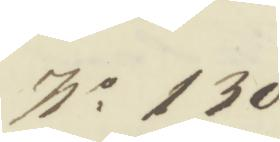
N:o 130
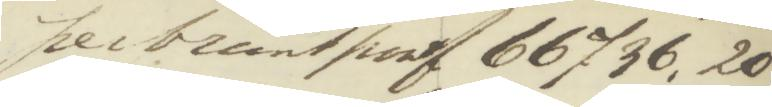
Per transport ƒ 66736, 20
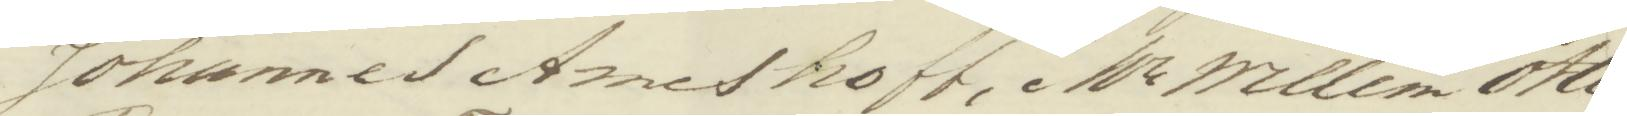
Johannes Ameshoff, Mr Willem Otto
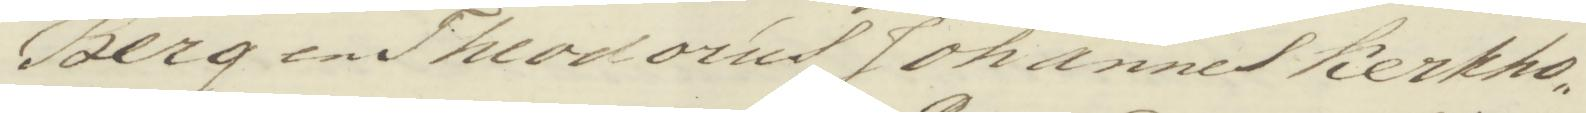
Berg en Theodorus Johannes Kerkho„
